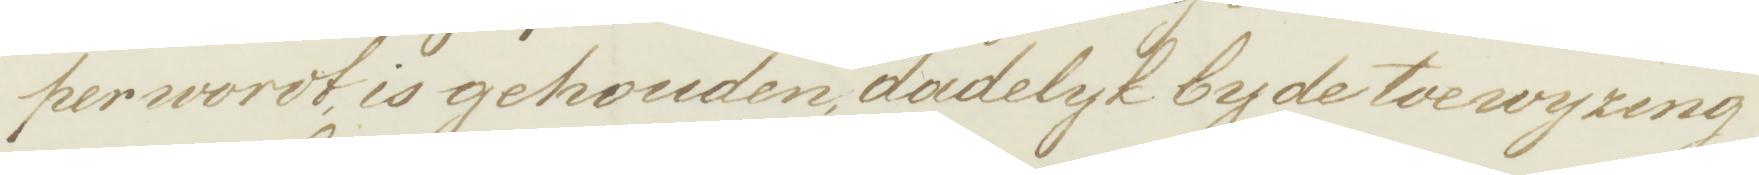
per wordt, is gehouden, dadelyk bij de toewyzing
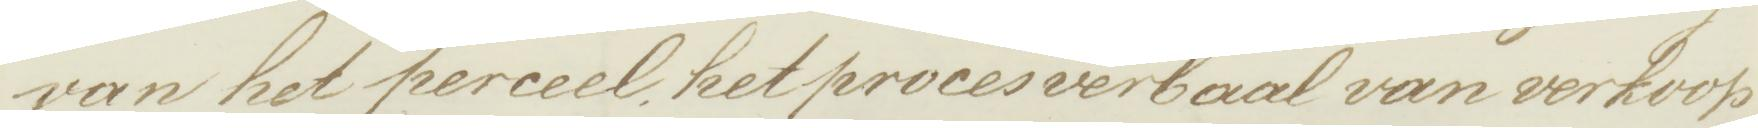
van het perceel, het procesverbaal van verkoop
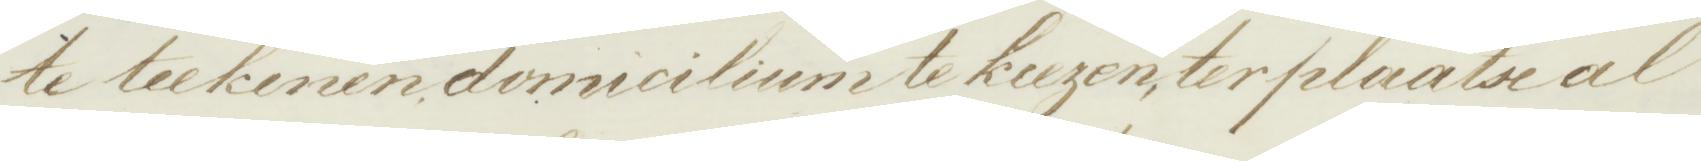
te teekenen, domicilium te keezen, ter plaatse al
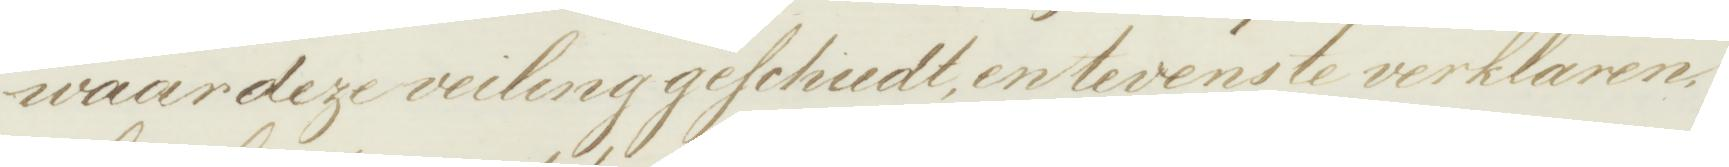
waar deze veiling geschiedt, en tevens te verklaren,
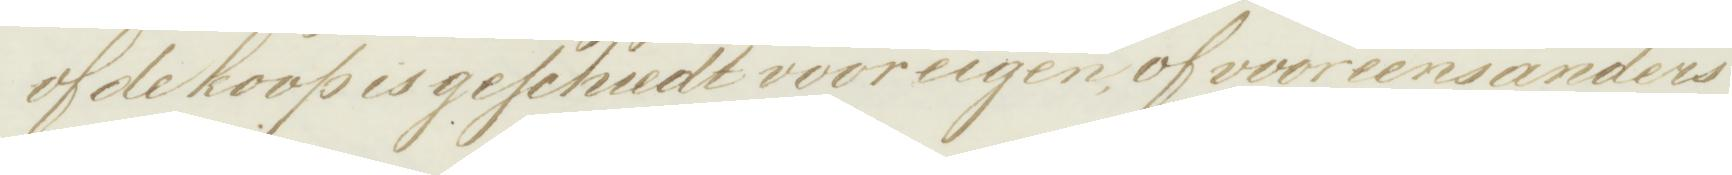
of de koop is geschiedt voor eigen, of voor eens anders
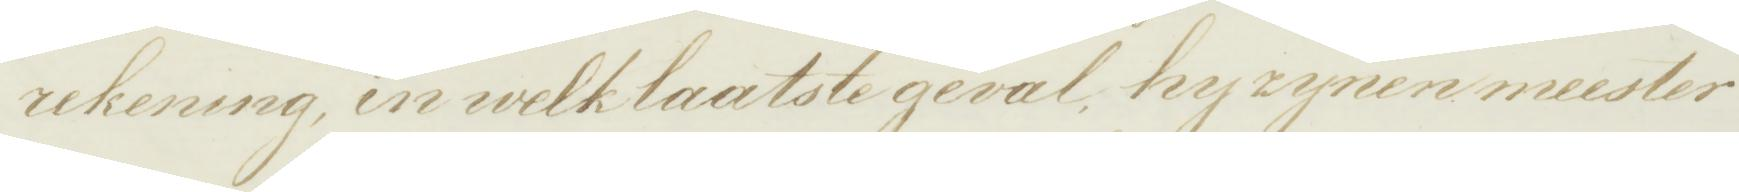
rekening, in welk laatste geval, hy zynen meester
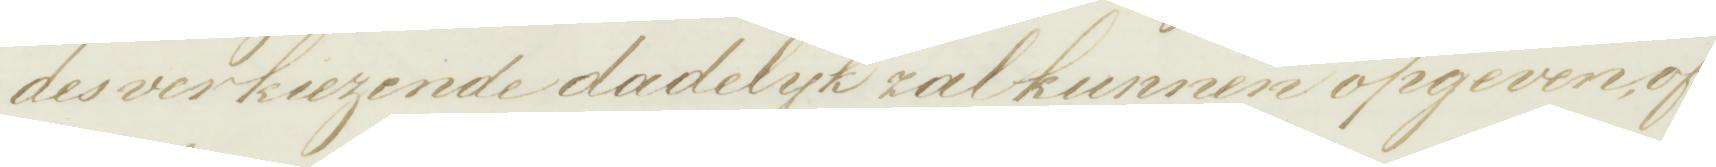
des verkiezende dadelyk zal kunnen opgeven, of
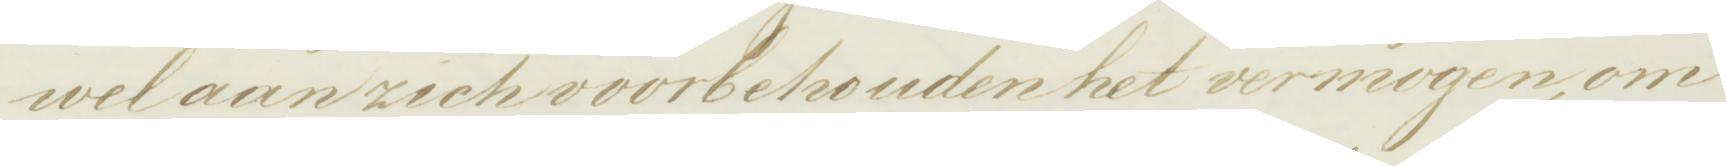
wel aan zich voorbehouden het vermogen, om
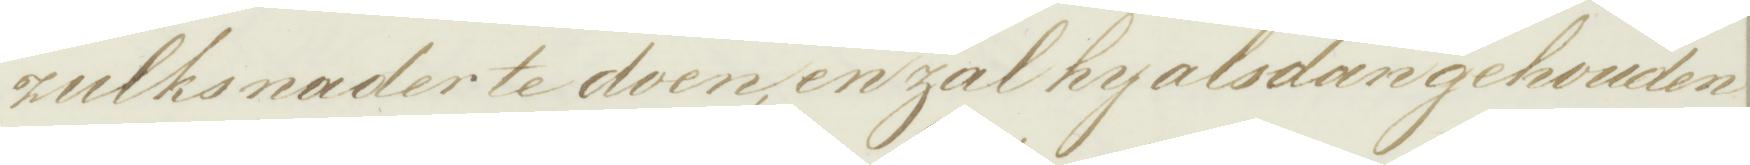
zulks nader te doen, en zal hy als dan gehouden
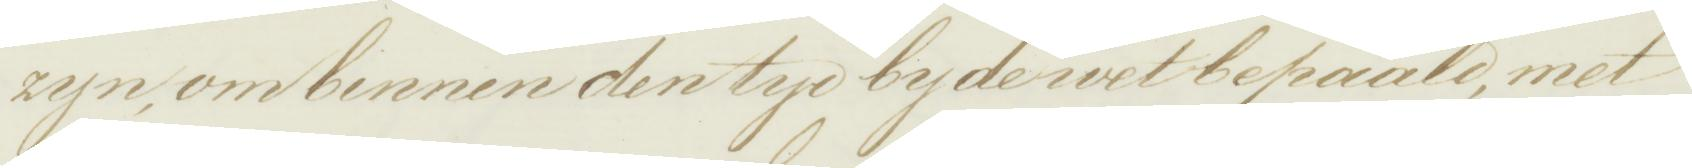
zyn, om binnen den tyd by de wet bepaald, met
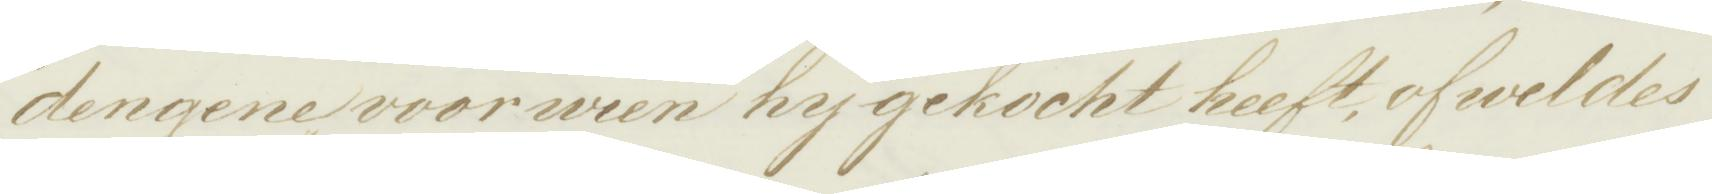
dengene voor wien hy gekocht heeft, of wel des
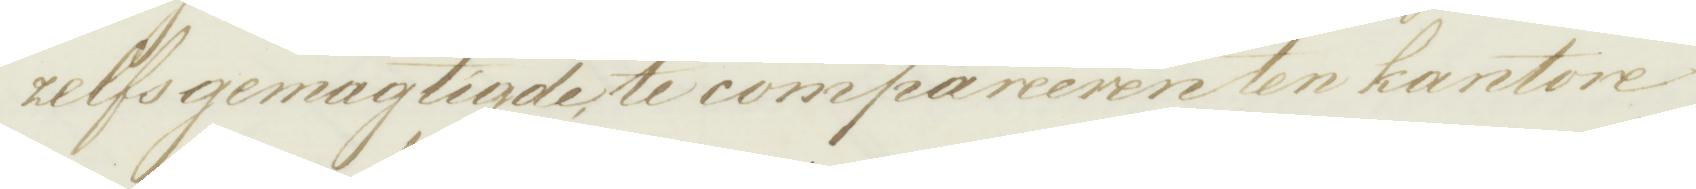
zelfs gemagtigde, te compareeren ten kantore
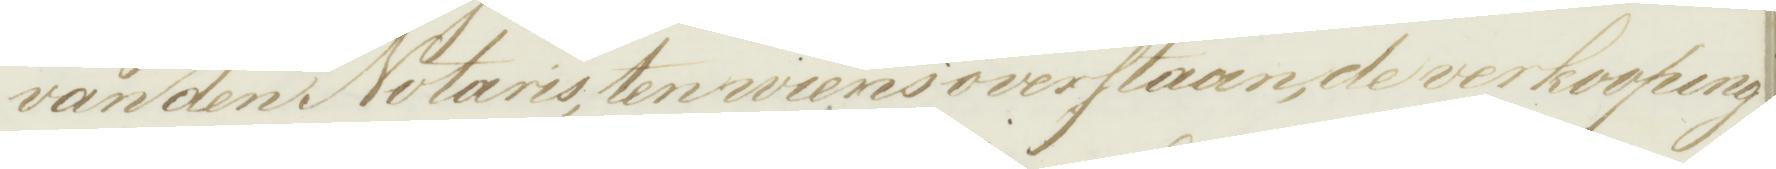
van den Notaris, ten wiens overstaan, de verkooping
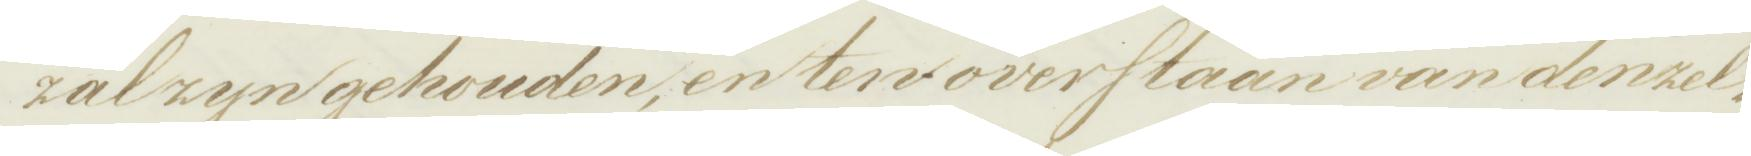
zal zyn gehouden, en ten overstaan van denzel„
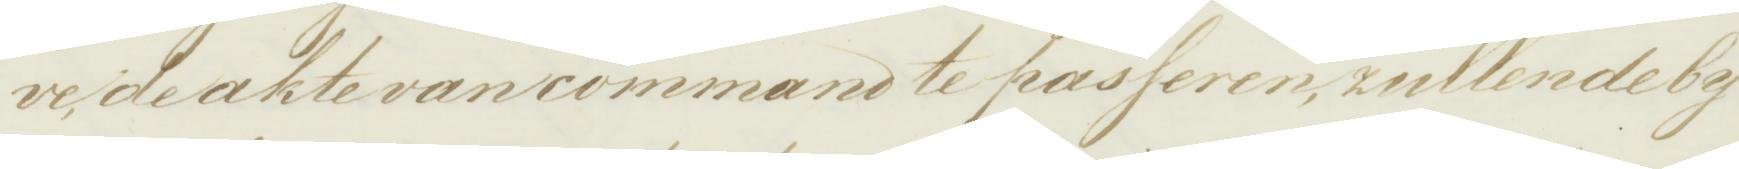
ve, de akte van command te passeren, zullende by
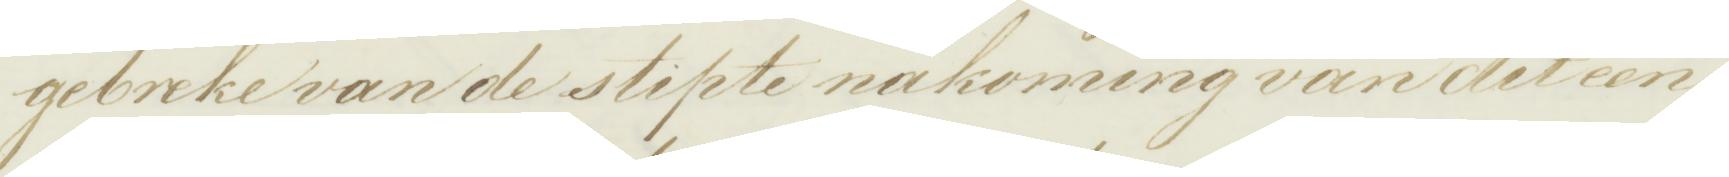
gebreke van de stipte nakoming van dit een
